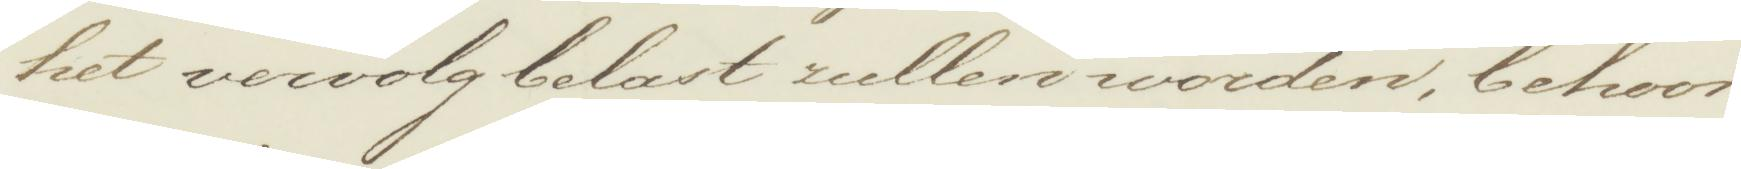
het vervolg belast zullen worden, behoor
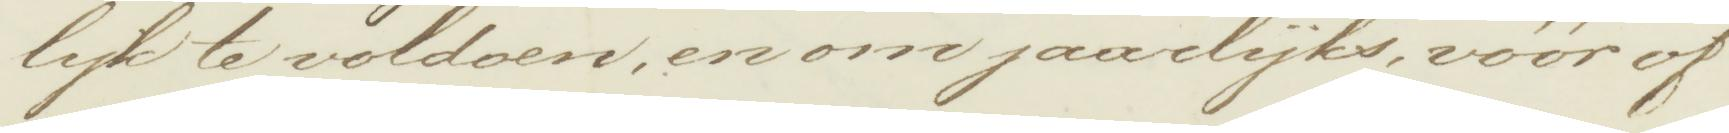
lyk te voldoen, en om jaarlijks, vóór of
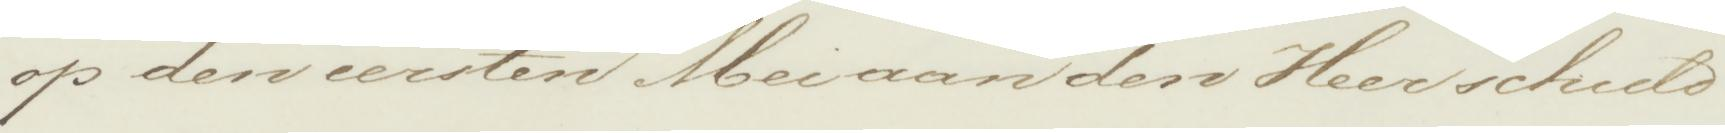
op den eersten Mei aan den Heer schuld
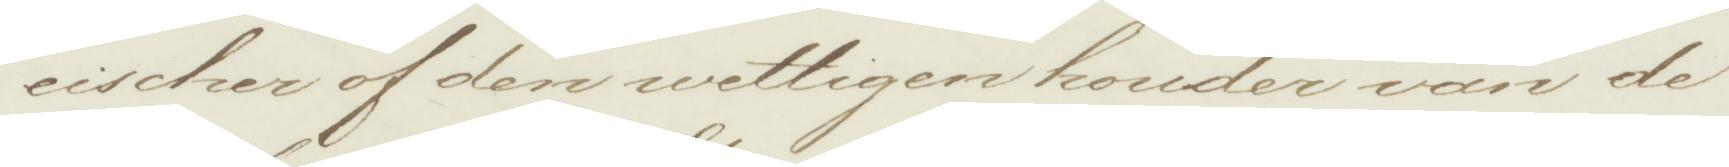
eischer of den wettigen houder van de
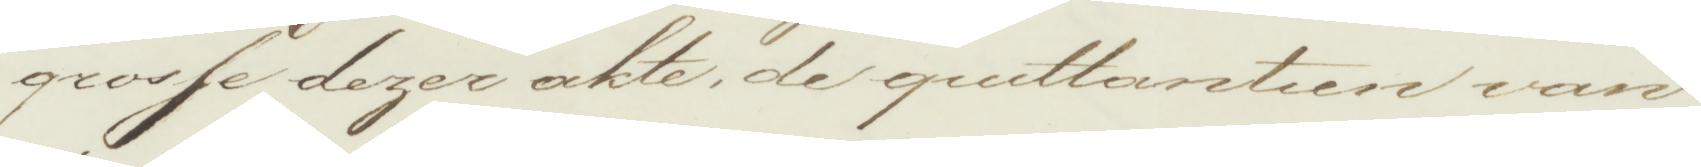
grosse dezer akte, de quittantien van
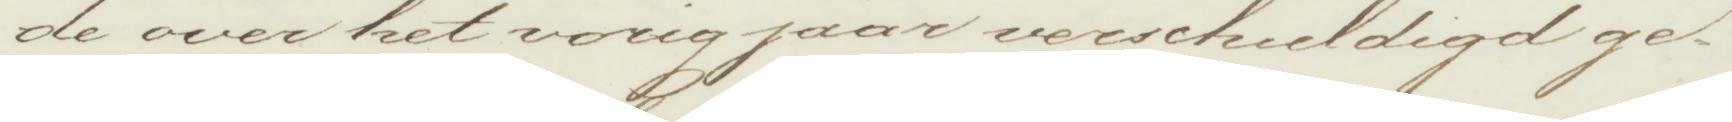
de over het vorig jaar verschuldigd ge=
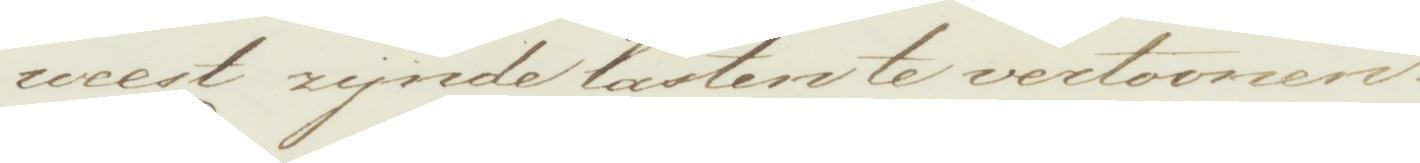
weest zijnde lasten te vertoonen
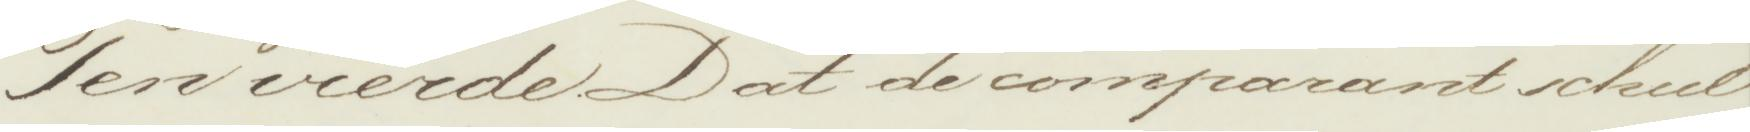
Ten vierde. Dat de comparant schul
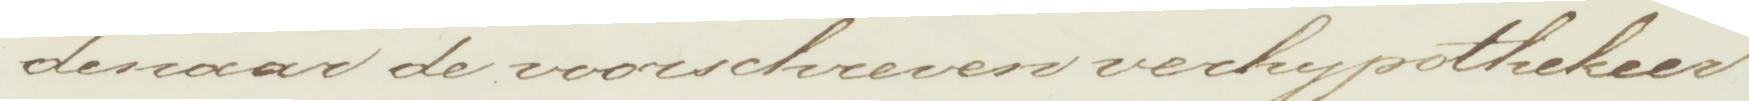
denaar de voorschreven verhypothekeer
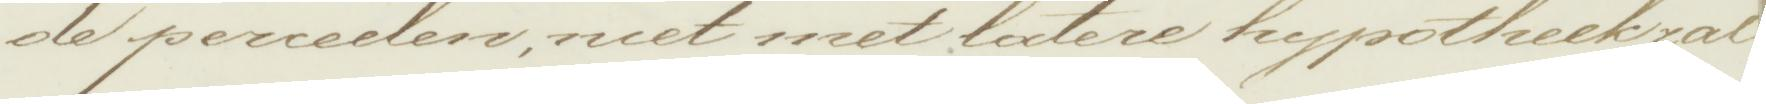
de perceelen, niet met latere hypotheek zal
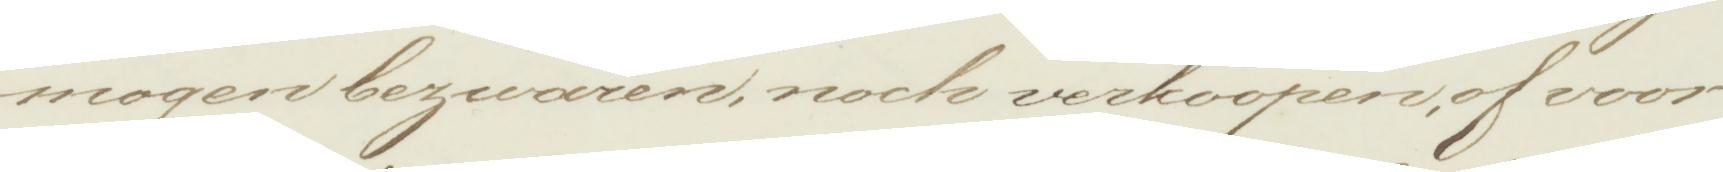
mogen bezwaren, noch verkoopen, of voor
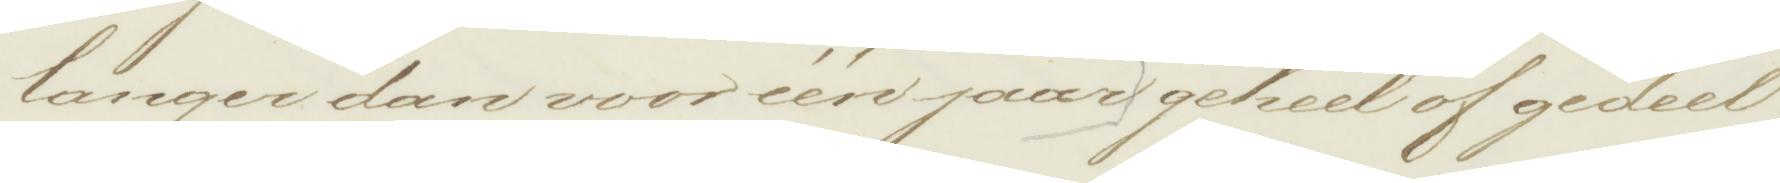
langer dan voor één jaar] geheel of gedeel
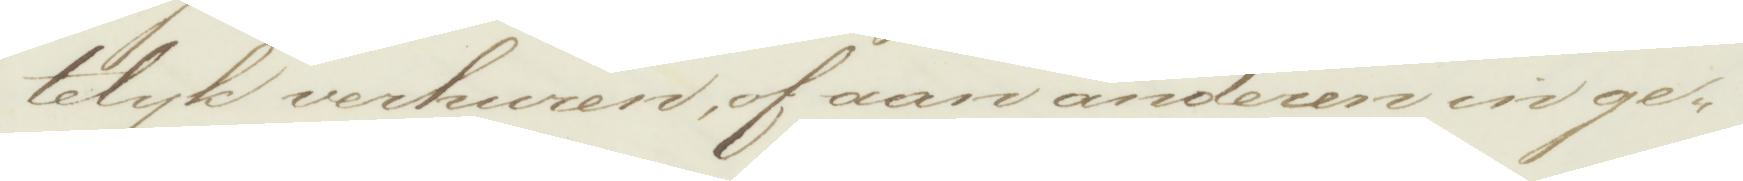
telyk verhuren, of aan anderen in ge„
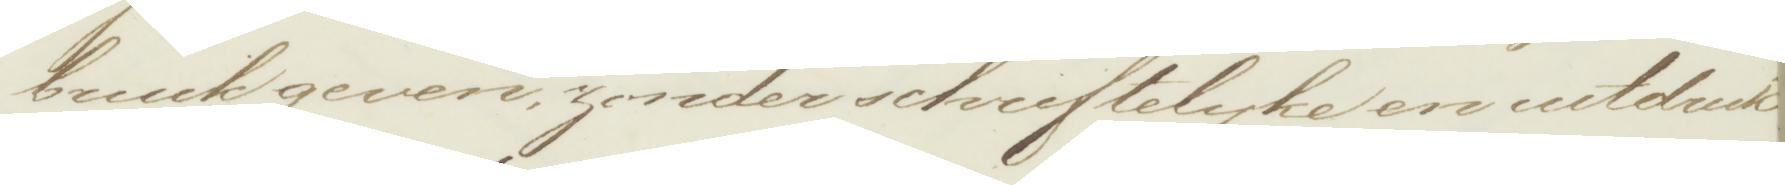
bruik geven, zonder schriftelyke en uitdruk
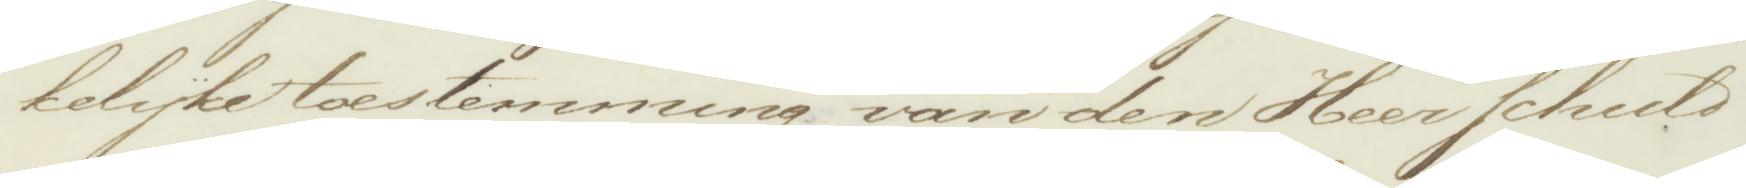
kelijke toestemming van den Heer schuld
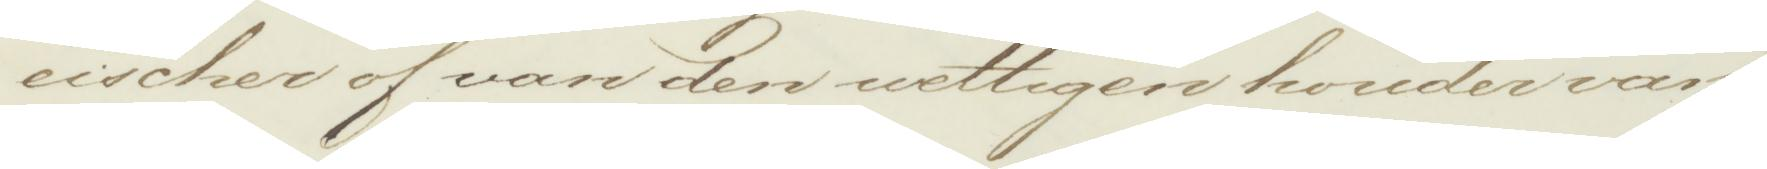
eischer of van den wettigen houder van
